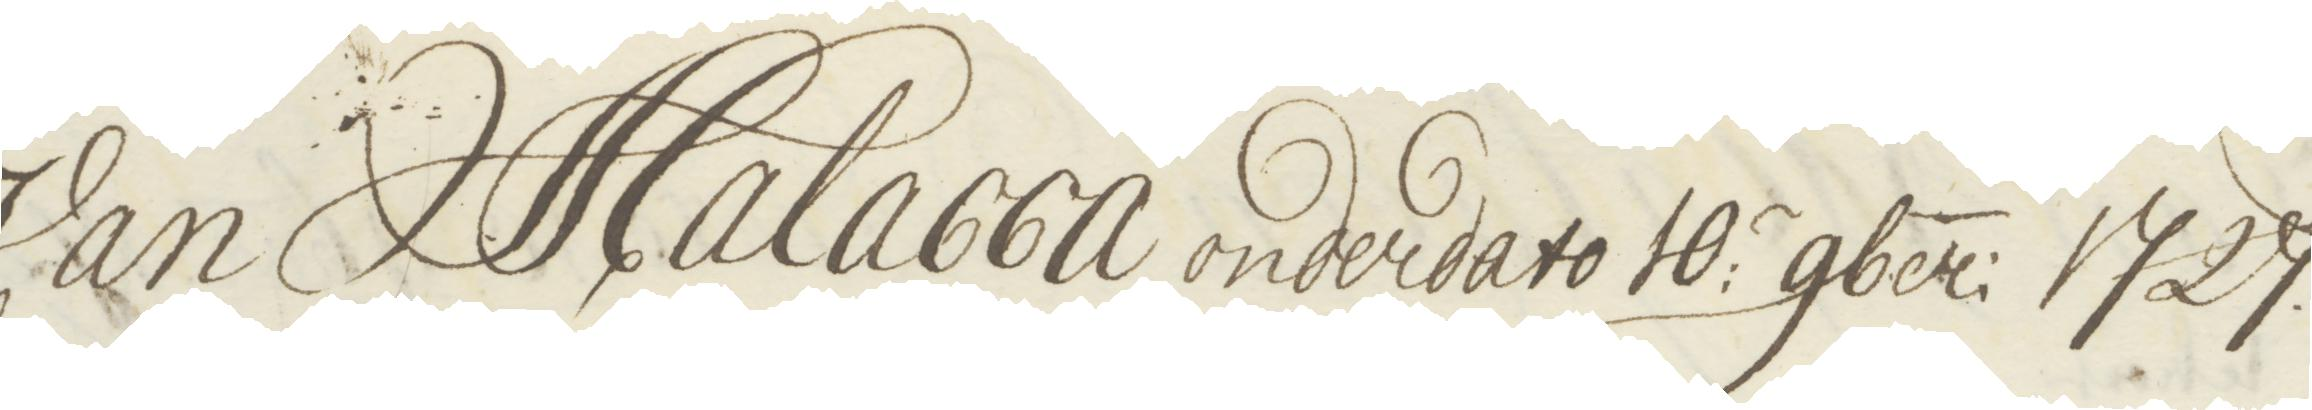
an Malacca onderdato 10:' 9ber: 1727.
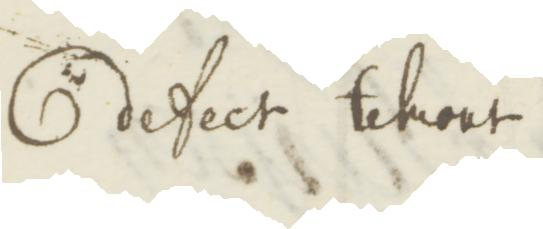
defect tekort
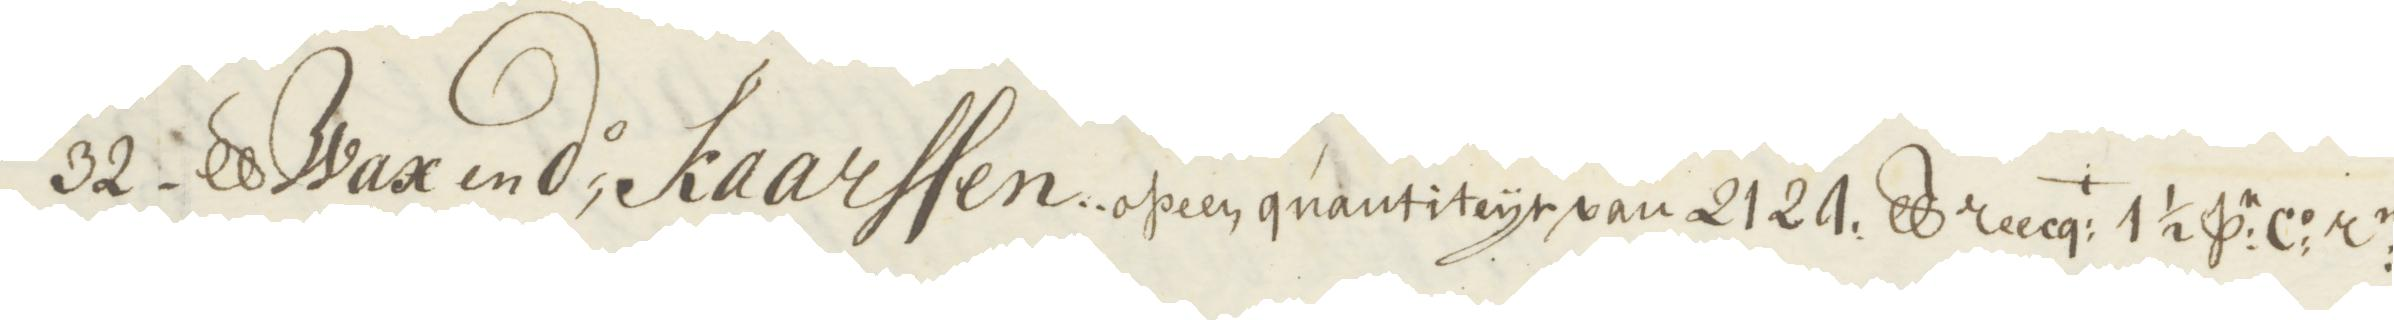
32 - lb Wax en d„o kaarssen.. op een quantiteijt van 2124. lb reecq:t 1½ p:r c:o r
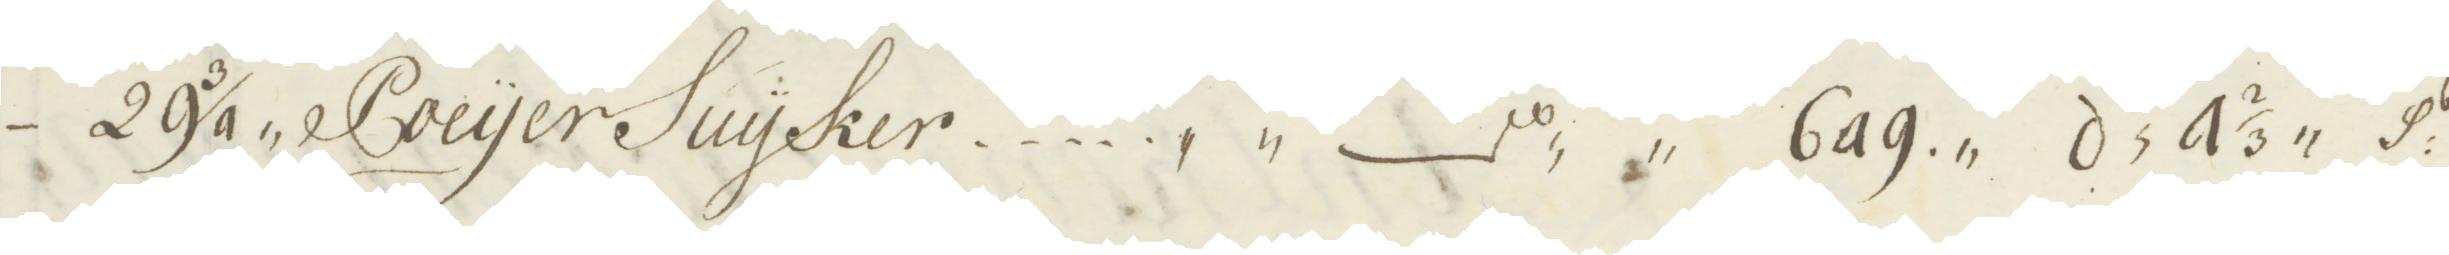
- 29¾ „ Poeijer Suijker . . . . . „ „ _„o „ 649. „ d„o 4 2/3 „ s
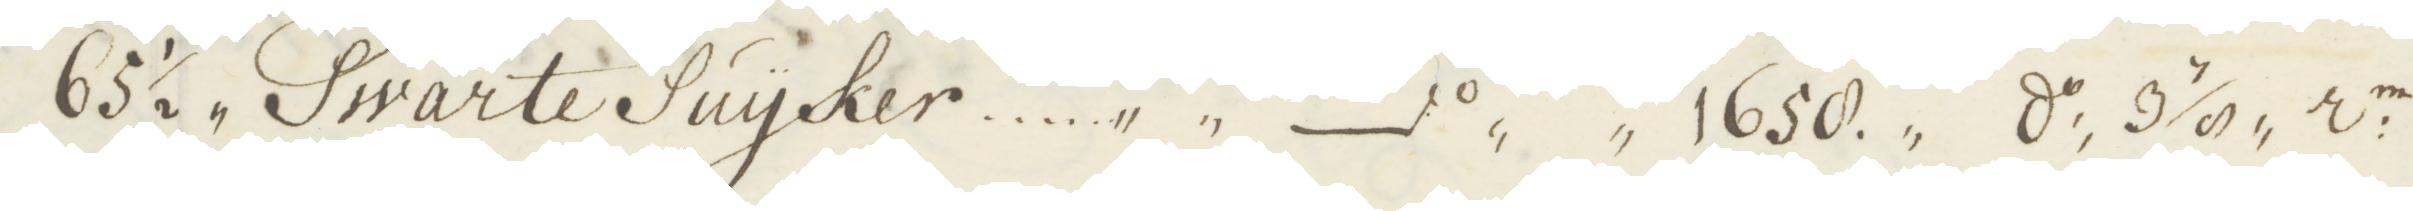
65½ „ Swarte Suijker . . . . . . „ „ _„o „ 1658. „ d„o 3 7/8 „ r:m
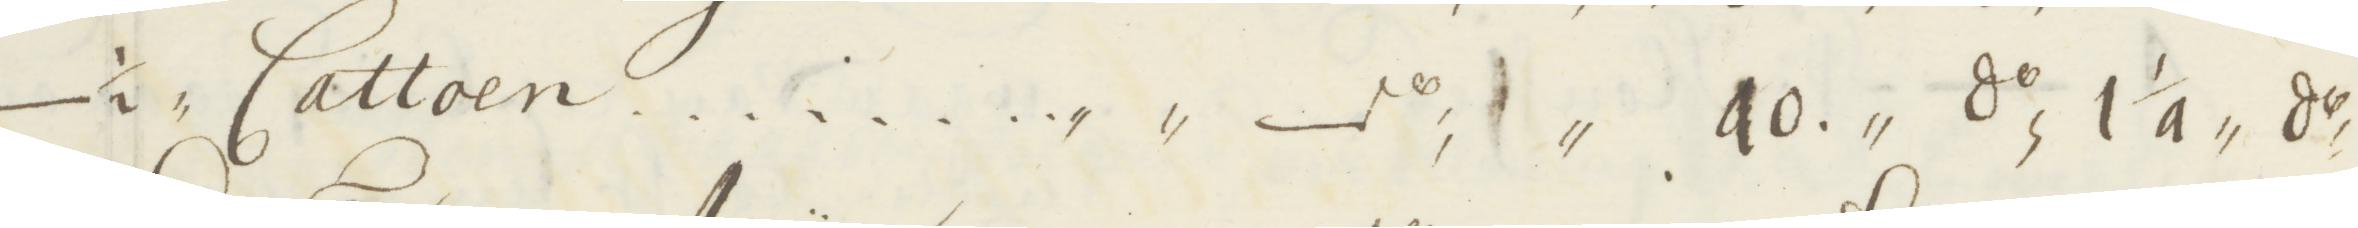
—½ „ Cattoen . . . . . . . . „ „ _„o „ 40. „ d„o 1¼ „ d„o
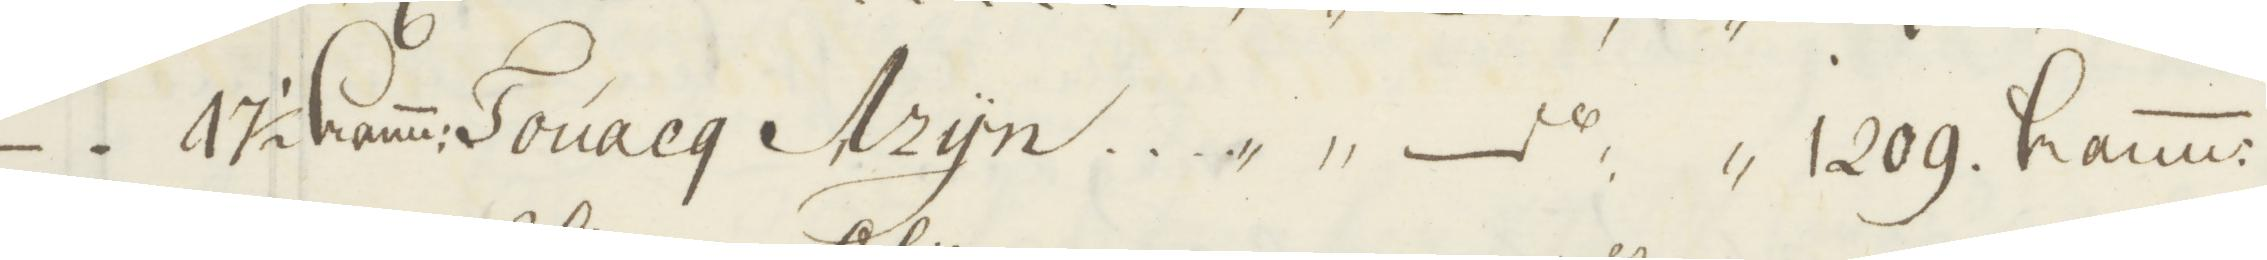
— - 47½ kann: Touacq Azijn . . . . „ „ _„o „ 1209. kann:
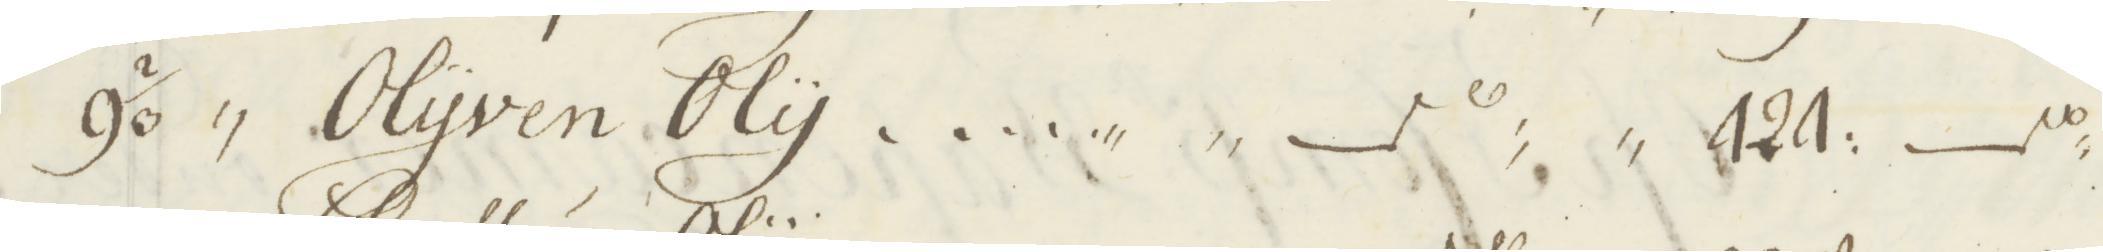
9 2/3 „ Olijven Olij . . . . .„ „ _„o „ 484: _„o
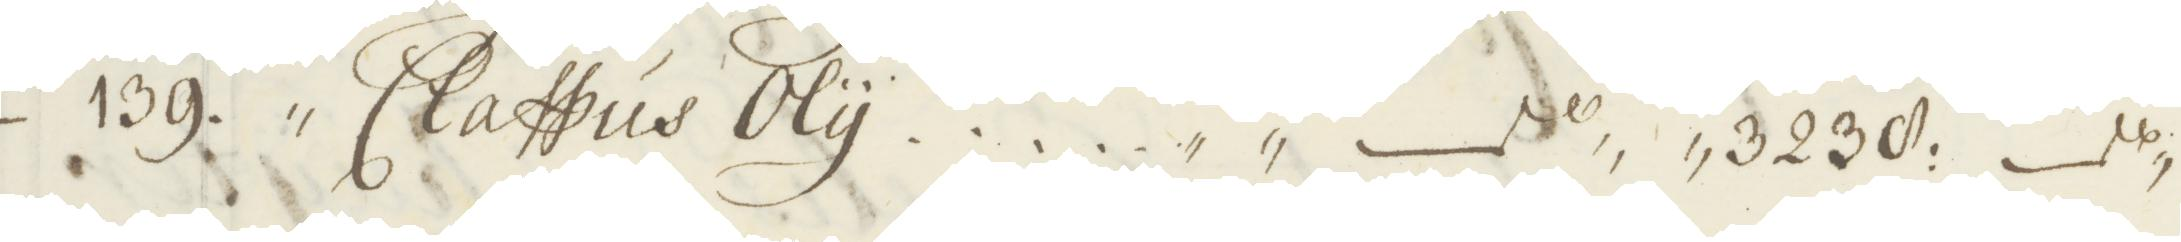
139. „ Clappus Olij . . . . . „ „ _„o „3238: _„o
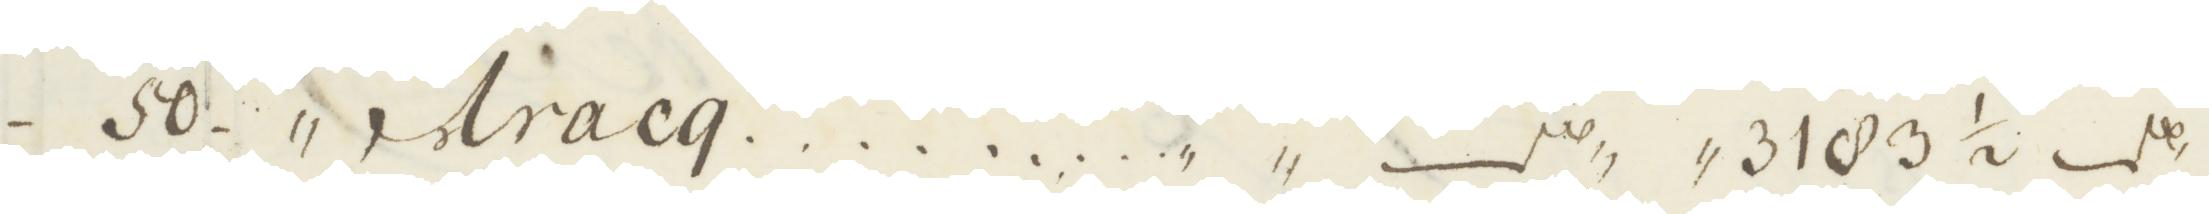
— - 50- „ Aracq . . . . . . . . „ „ _„o „3183½ _„o
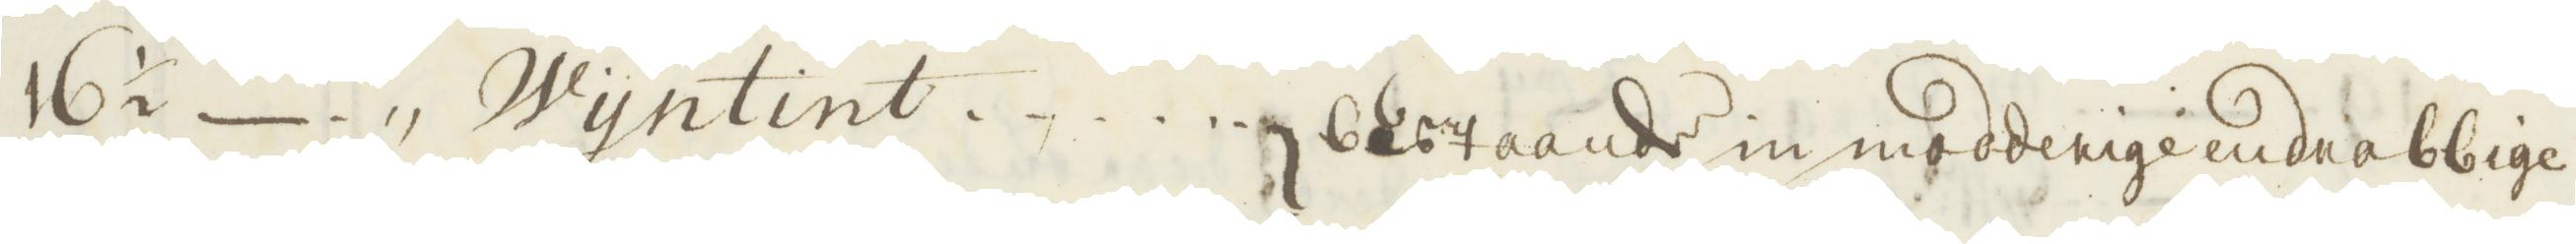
16½ — - „ Wijntint . . . . . bestaande in modderige en drabbige
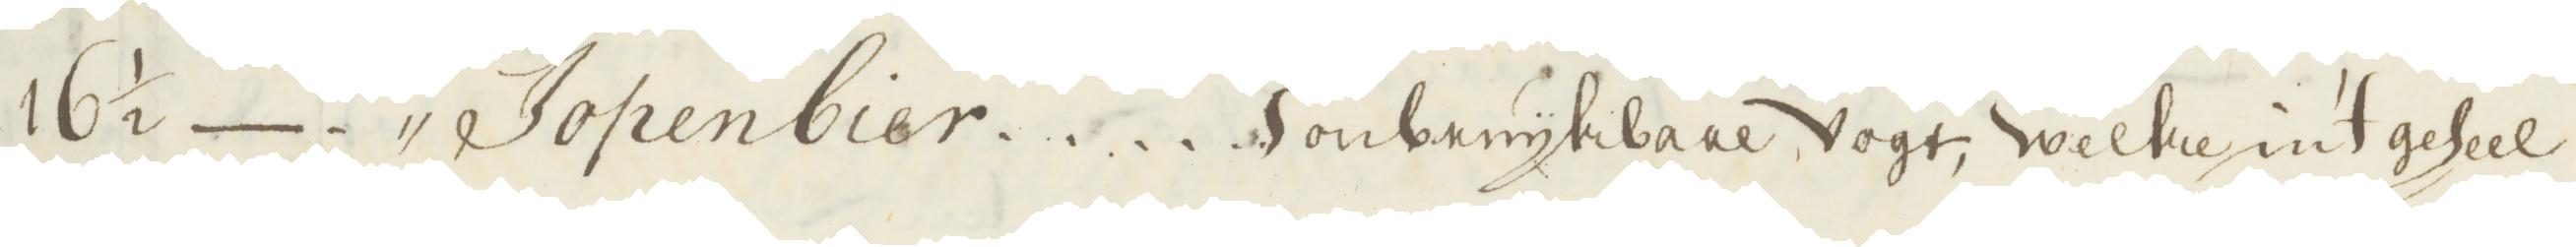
16½ — - „ Iopenbier . . . . . . . onbruijkbare vogt, welke in 't geheel
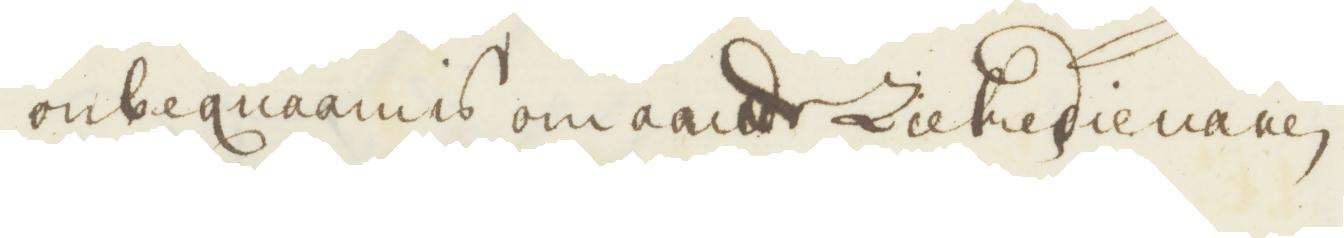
onbequaam is om aan de zieke dienaren
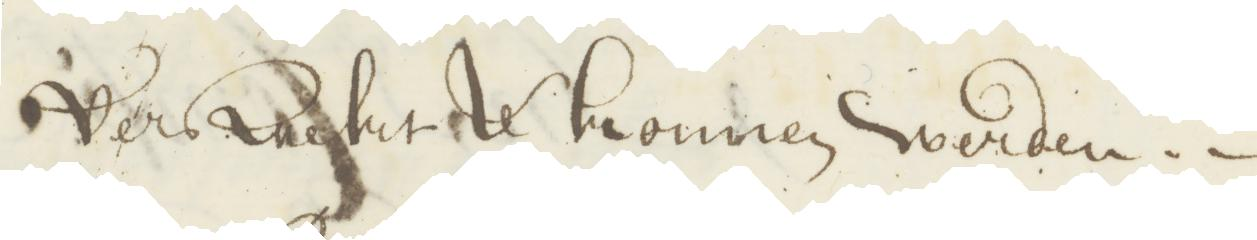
verstrekt te konnen werden.—
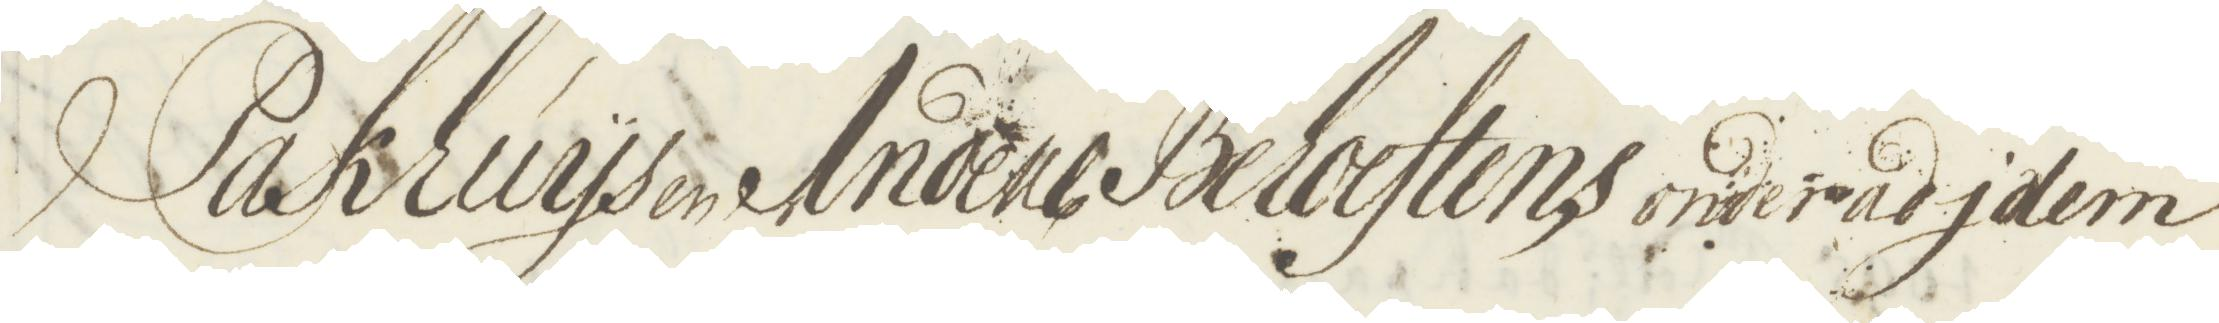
Pakhuijsen Andere Behoeftens onder ad jdem
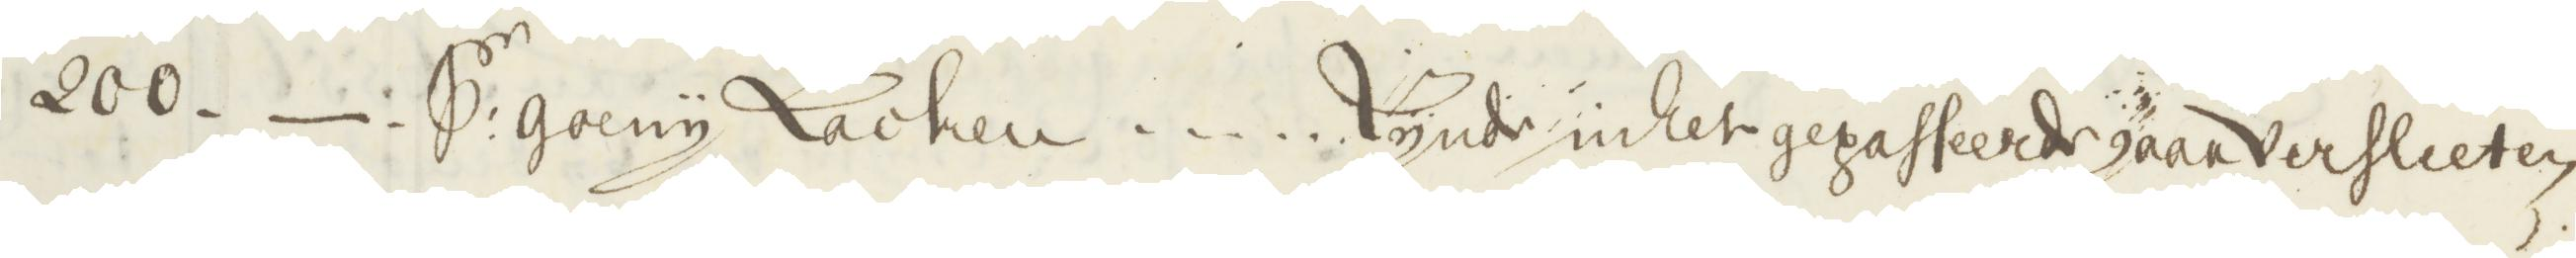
200- —: p:s goenij zacken . . . . zijnde in het gepasseerde jaar versleeten
